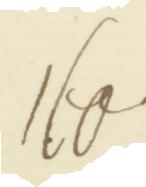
1601
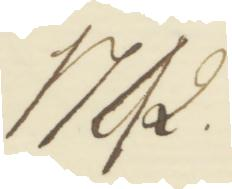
1742.
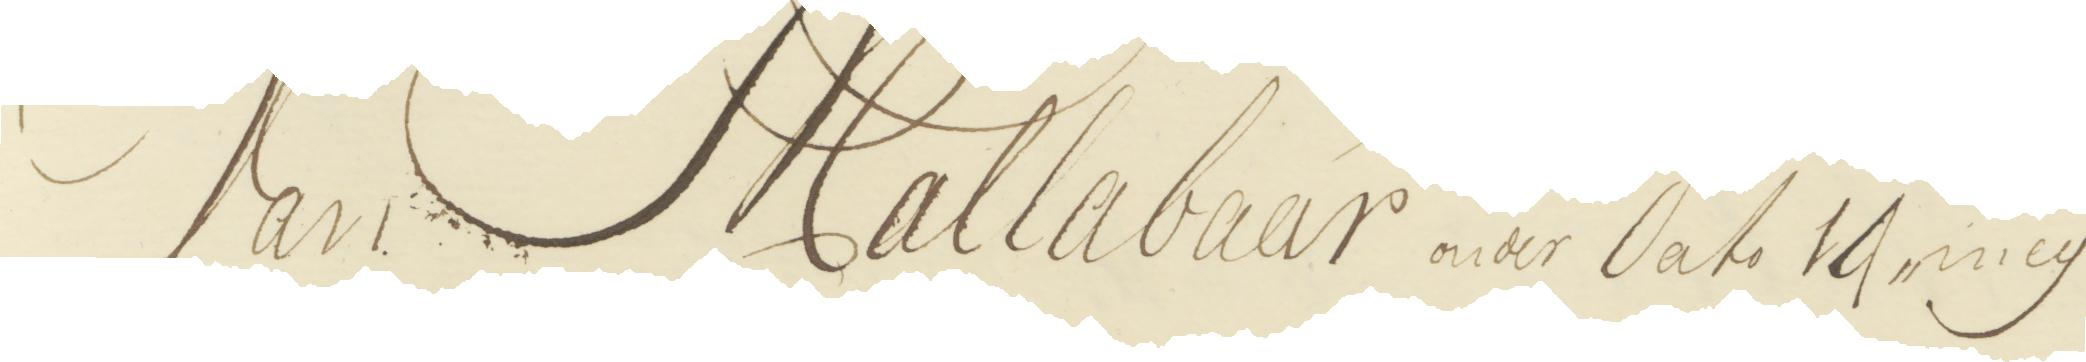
Van Mallabaar onder dat 14„' meij
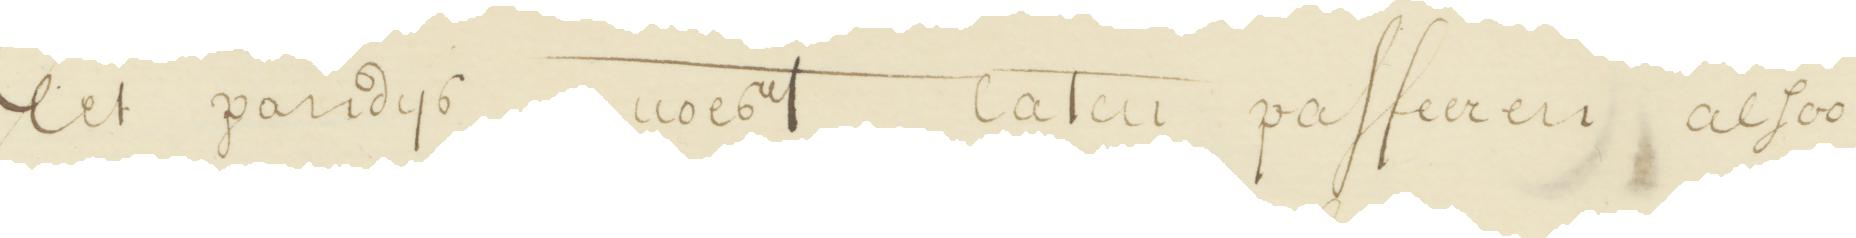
het pandys moest laten passeeren alsoo
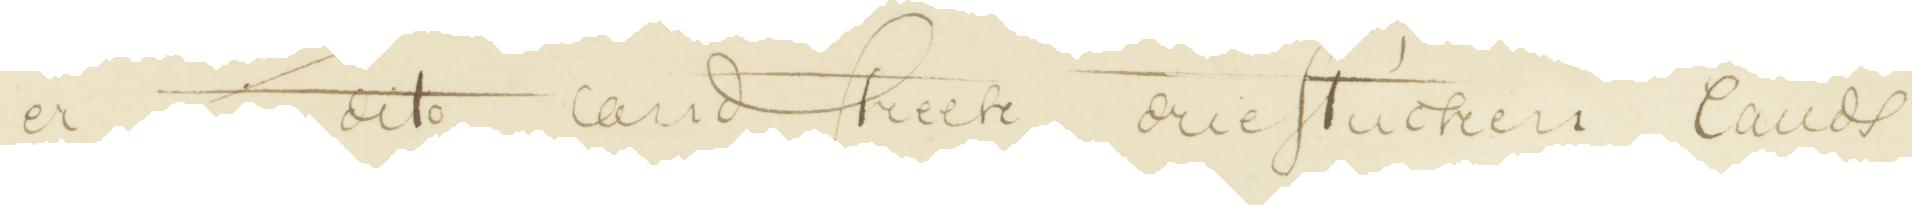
er in dito landstreek drie stucken lands
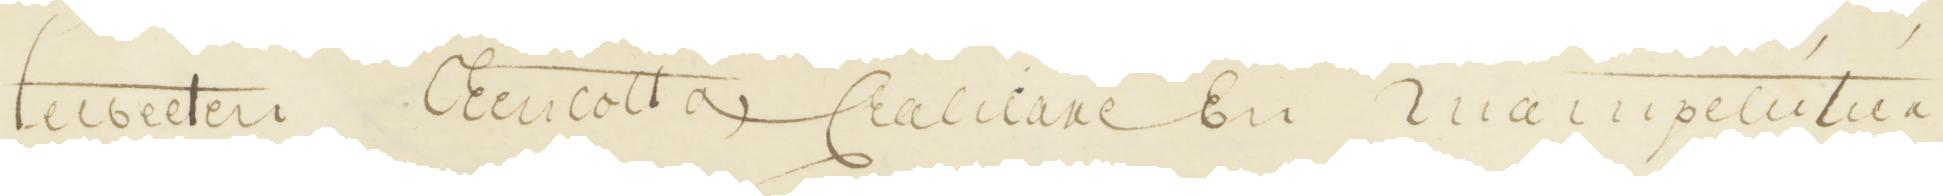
teweeten Chencotta, Chalilare En mampelutua
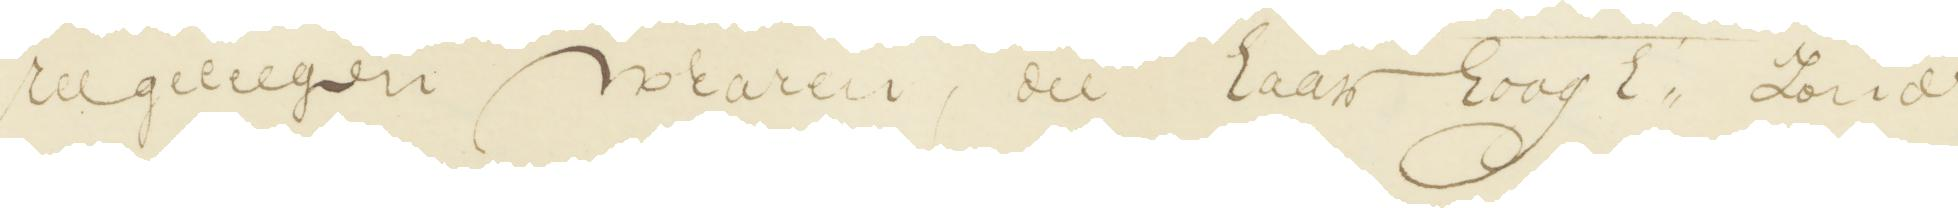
reegeleegen wharen, die haar hoog h„t zoude
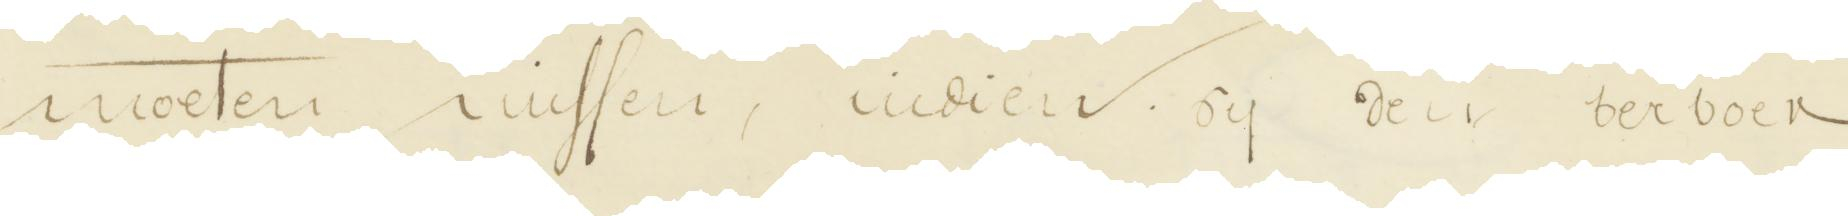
moeten missen, indien sy den vervoer
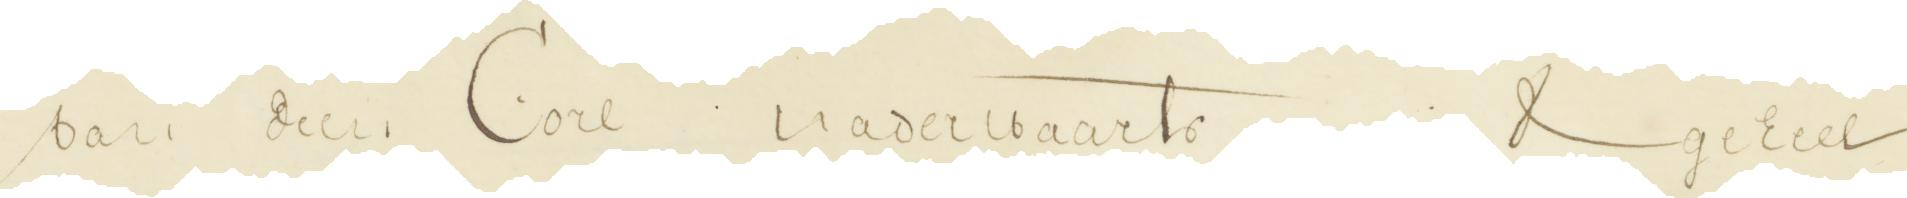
van dien Corl naderwaarts in t geheel
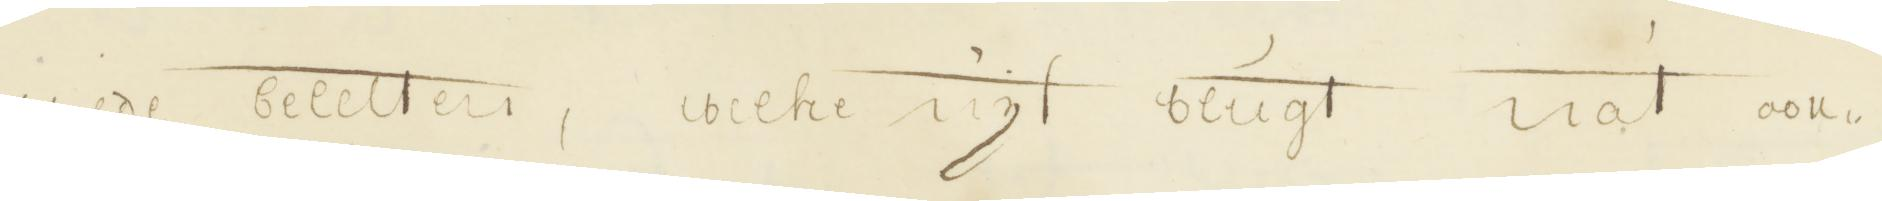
wilde beletten, welke uijt vlugt na't oor„
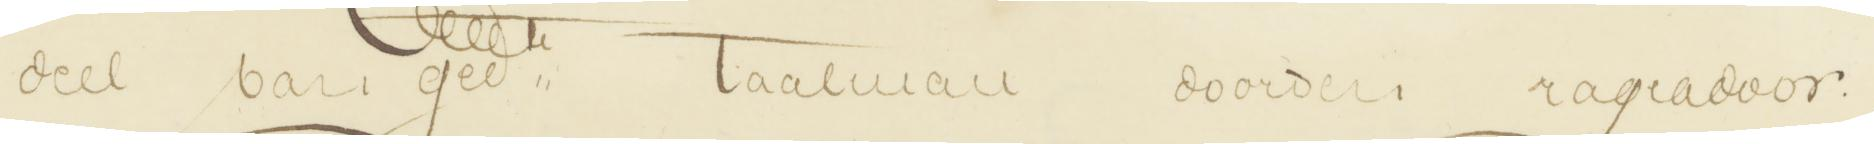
deel van ged„te Taalman doorden ragiadoor
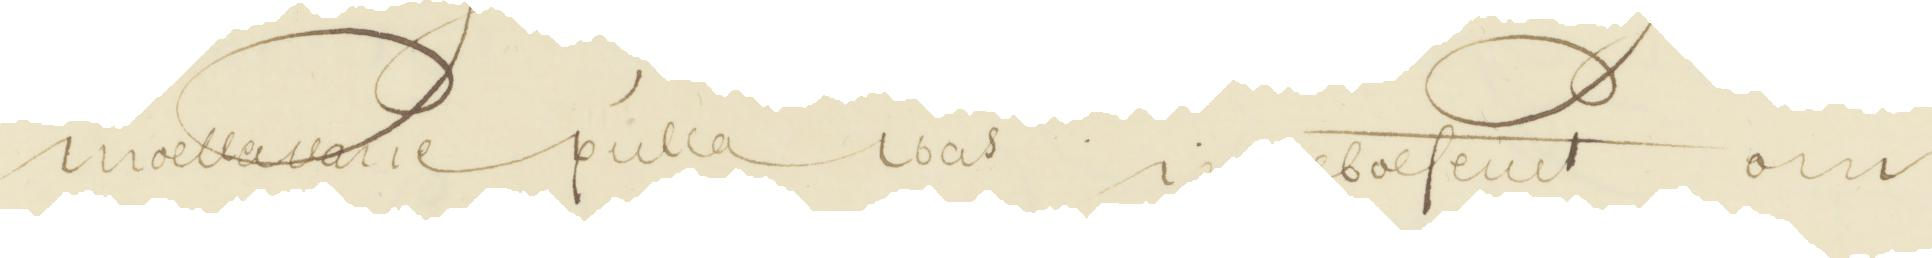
moellavane pulla was ingeboesemt om
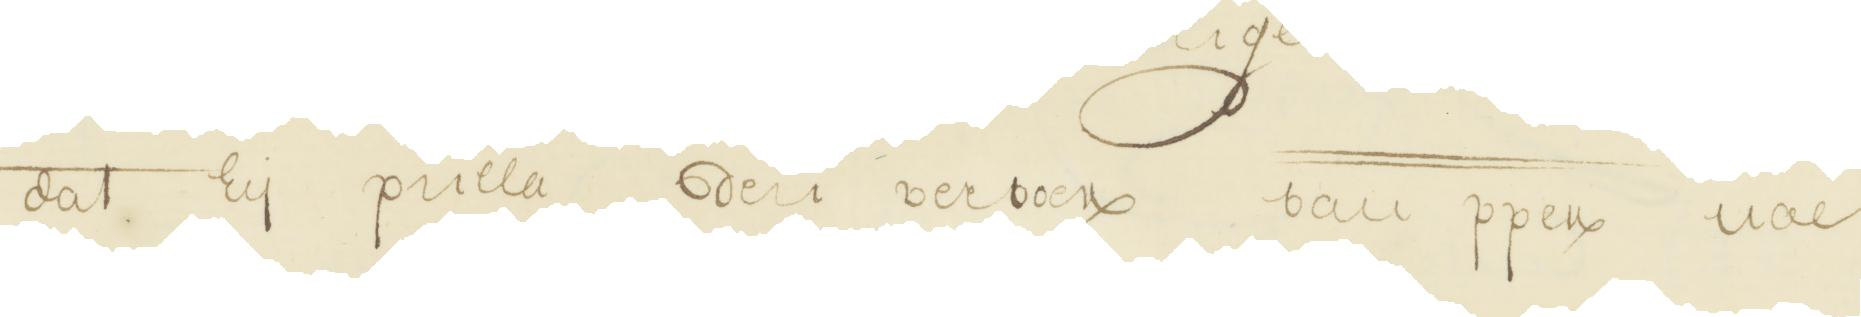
dat hij pulla den vervoer van pper nae
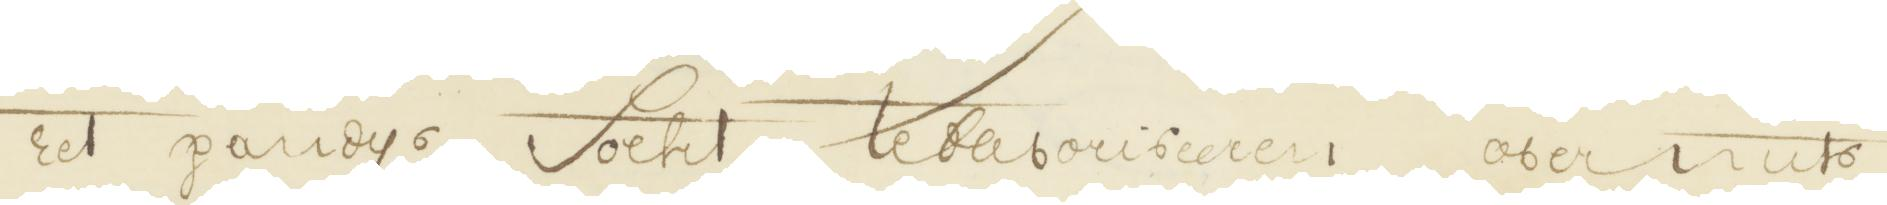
het pandys soekt tefavoriseeren over mits
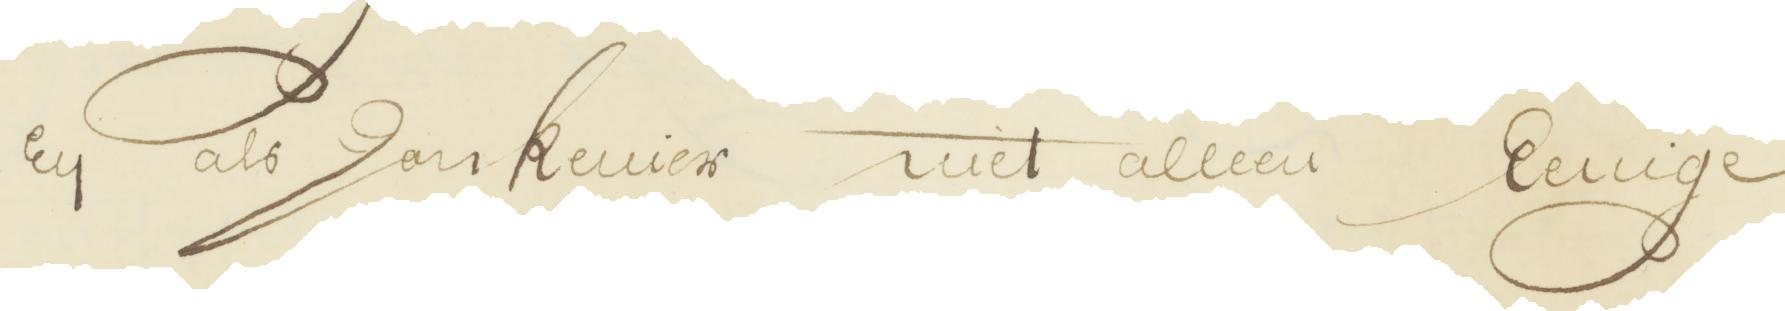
hy als Jonkenier niet alleen Eenige
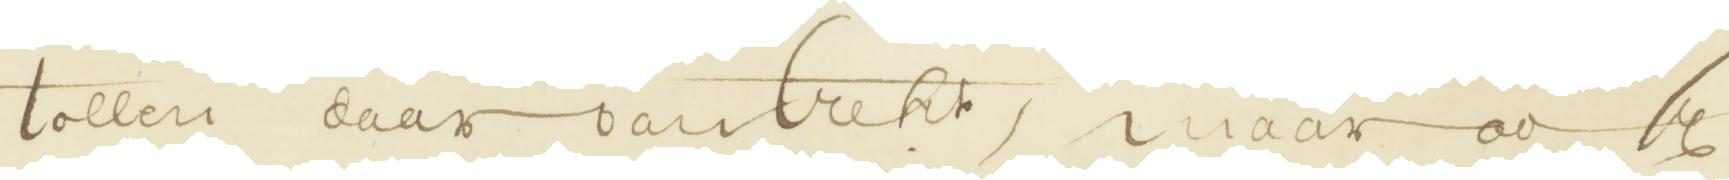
tollen daarvan trekt, maar ook
